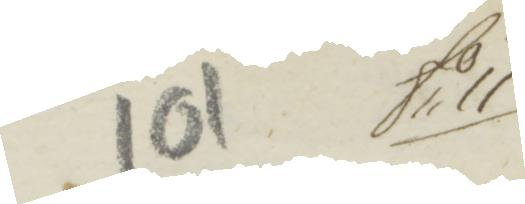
101 f„o 11
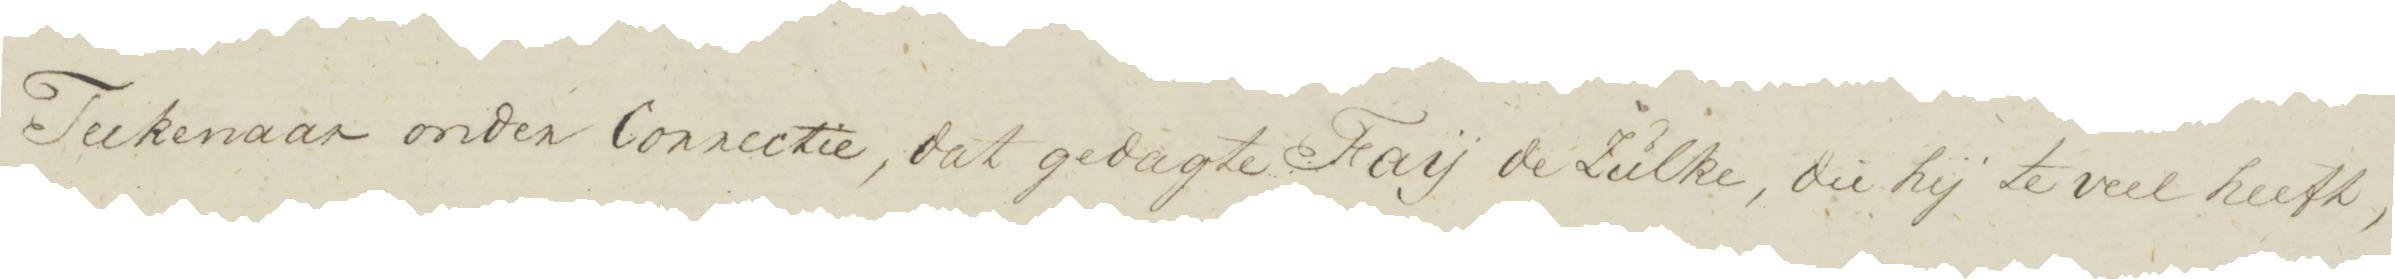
Teekenaar onder Correctie, dat gedagte Faij de zulke, die hij te veel heeft,
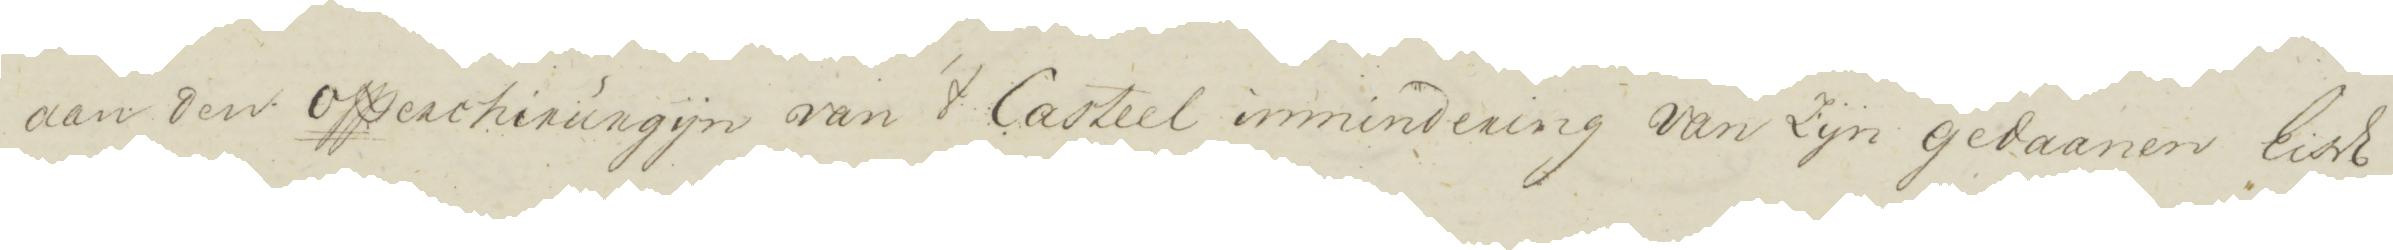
aan den opperchirurgijn van ’t Casteel inmindering van zijn gedaanen Eisch
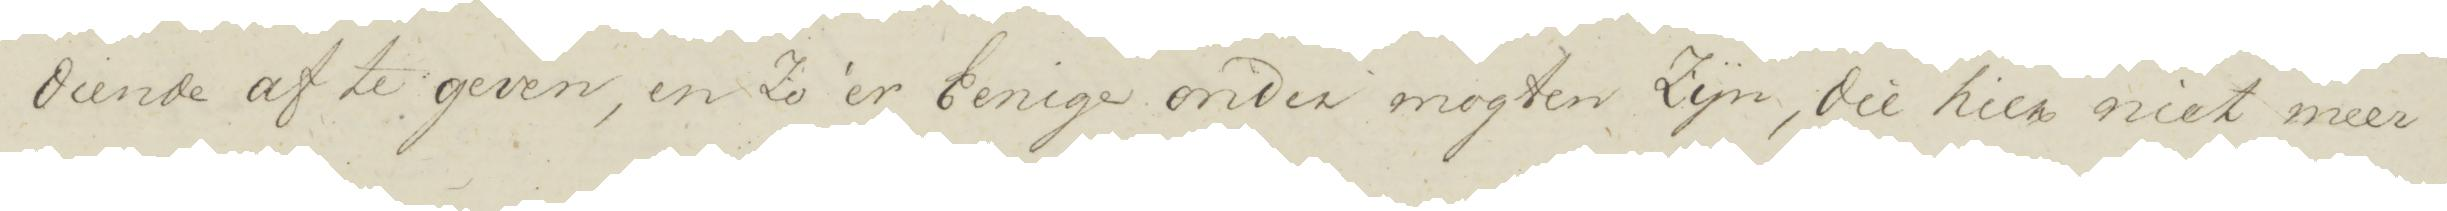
diende af te geven, en zo 'er Eenige onder mogten zijn, die hier niet meer
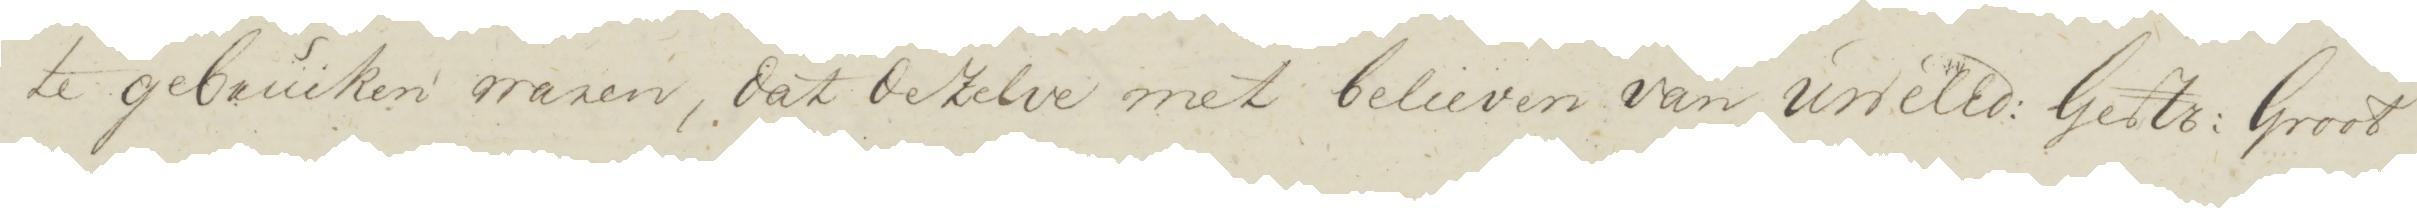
te gebruiken waren, dat dezelve met believen van uwelEd: Gestr: Groot
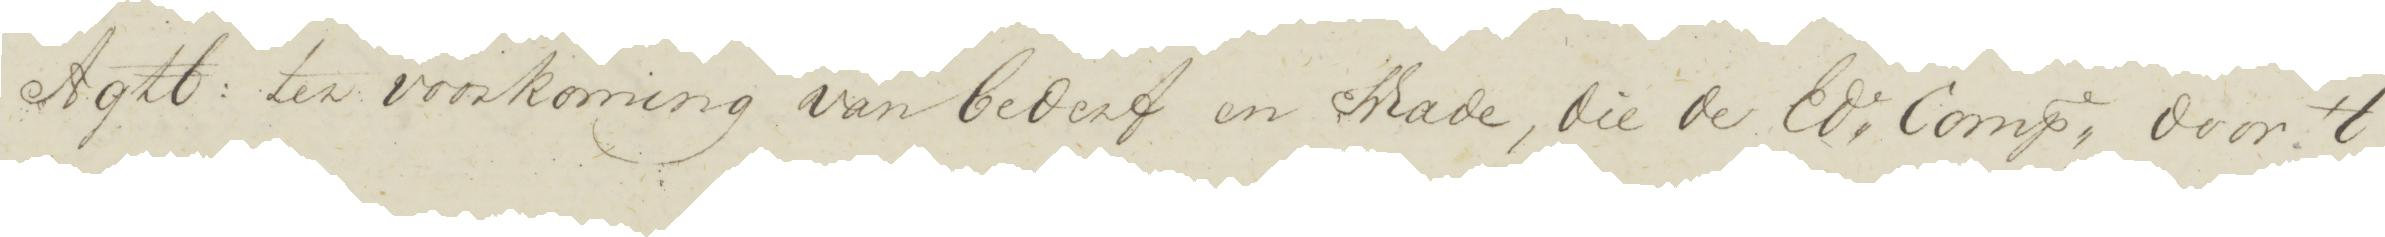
Agtb: ter voorkoming van bederf en schade, die de Ed„e Comp„e door ’t
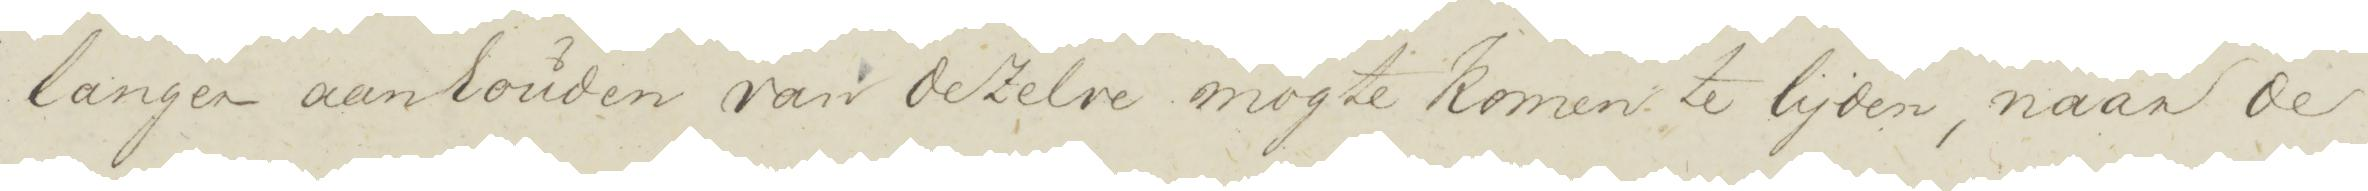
langer aanhouden van dezelve mogte komen te lijden, naar de
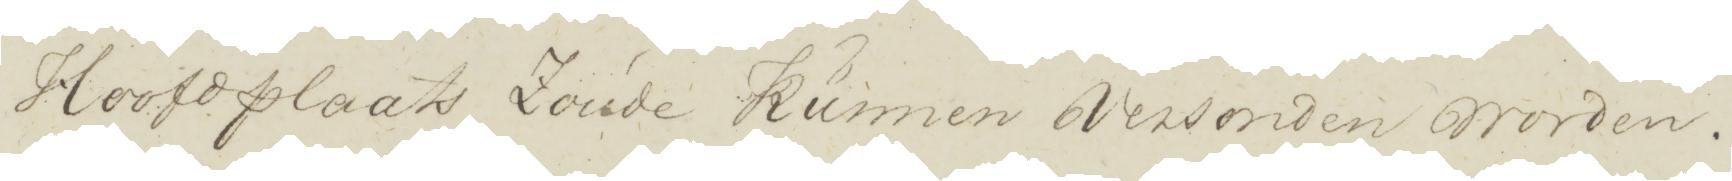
Hoofdplaats zoude kunnen versonden worden.
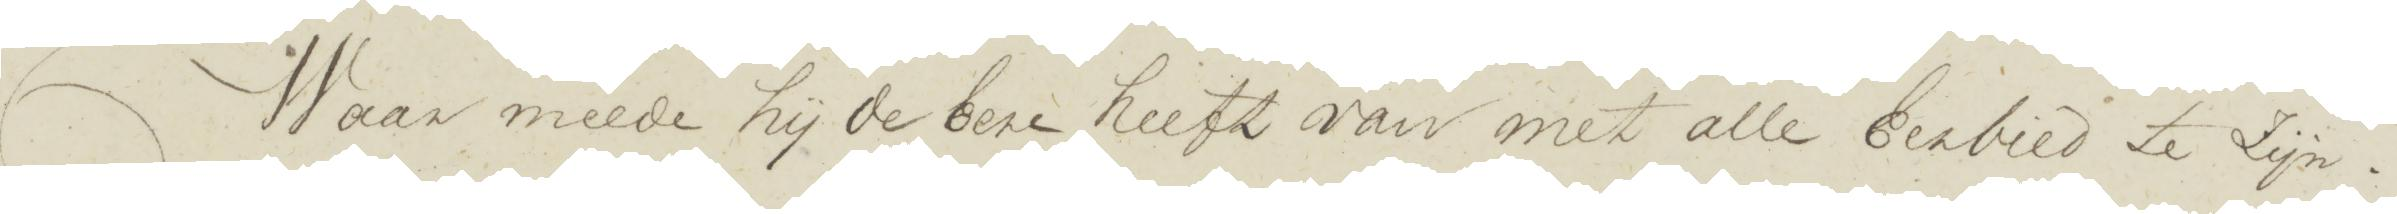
Waar meede hij de Eere heeft van met alle Eerbied te zijn.
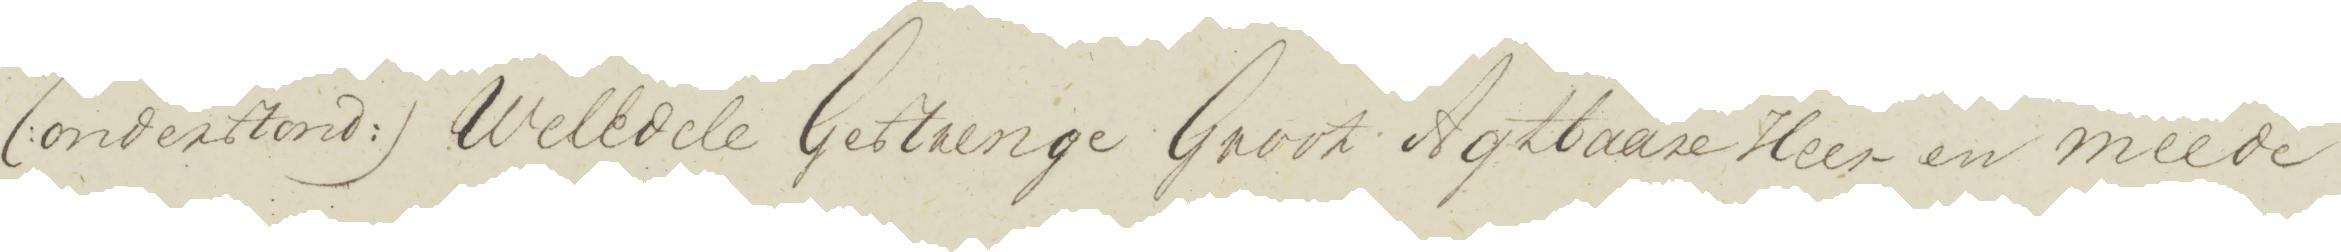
(:onderstond:) WelEdele Gestrenge Groot Agtbaare Heer en meede
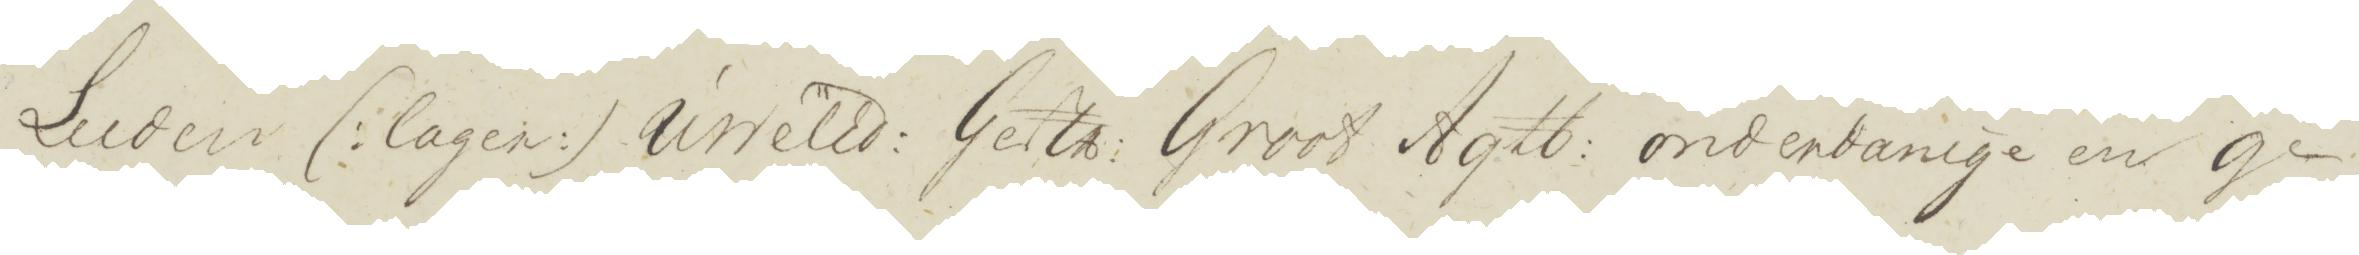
Leeden (:lager:) uwelEd: Gestr: Groot Agtb: onderdanige en ge„
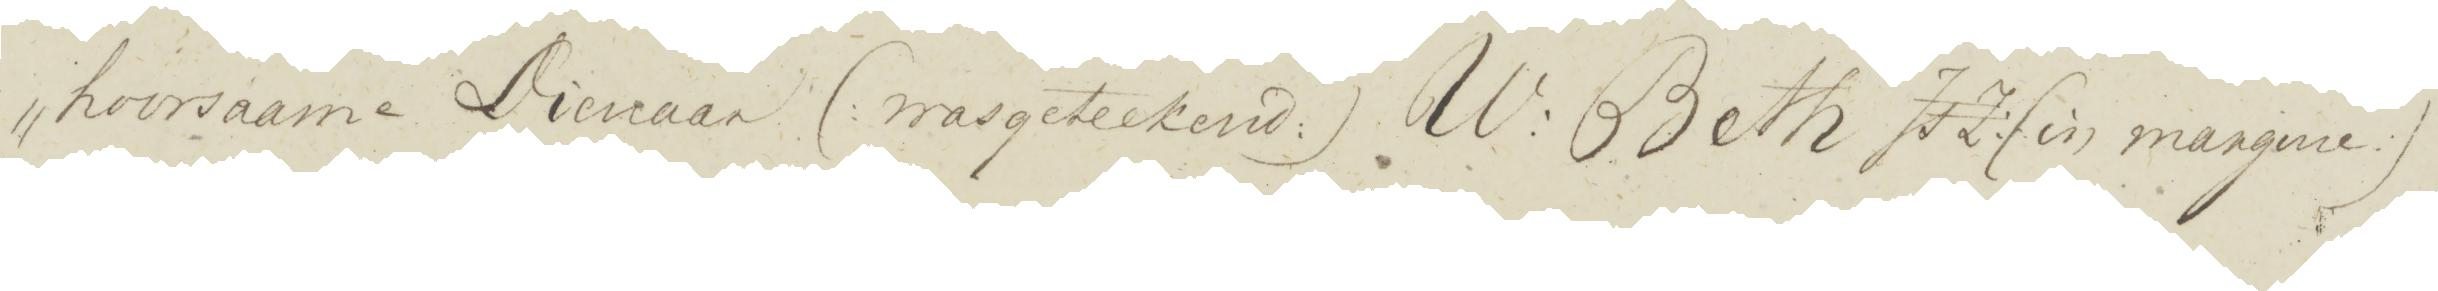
„hoorsaame Dienaar (:was geteekend:) W: Beth Jsz: (in margine:)
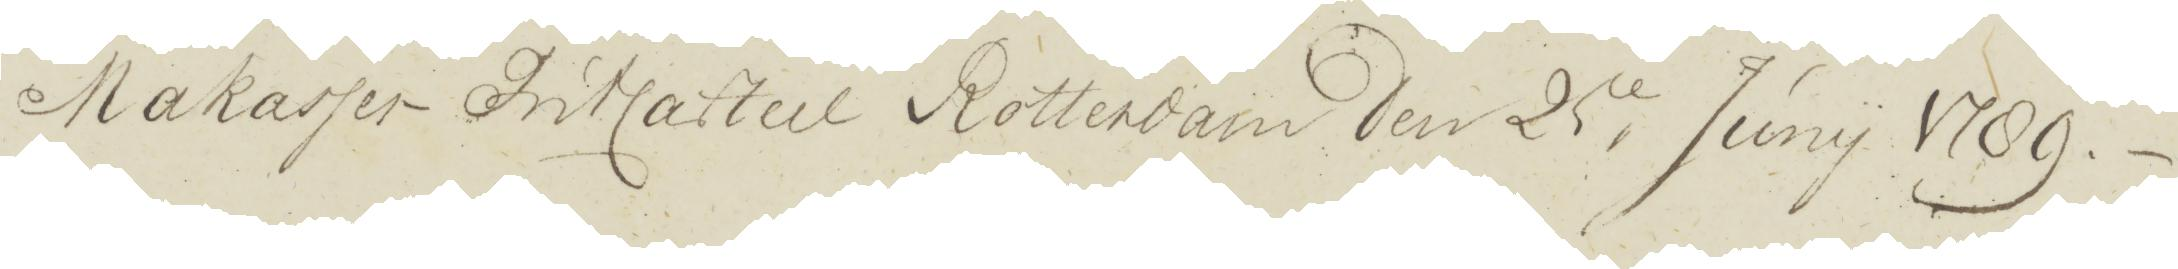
Makasser In't Casteel Rotterdam den 25„e Junij 1789. —
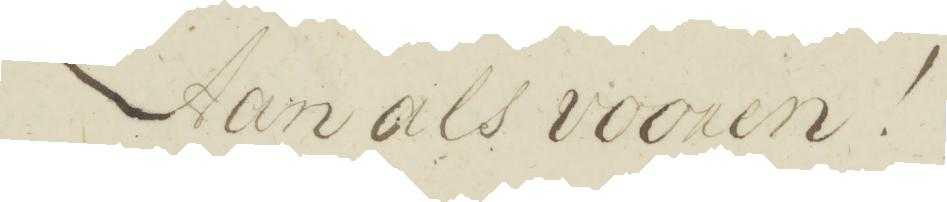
Aan als vooren!
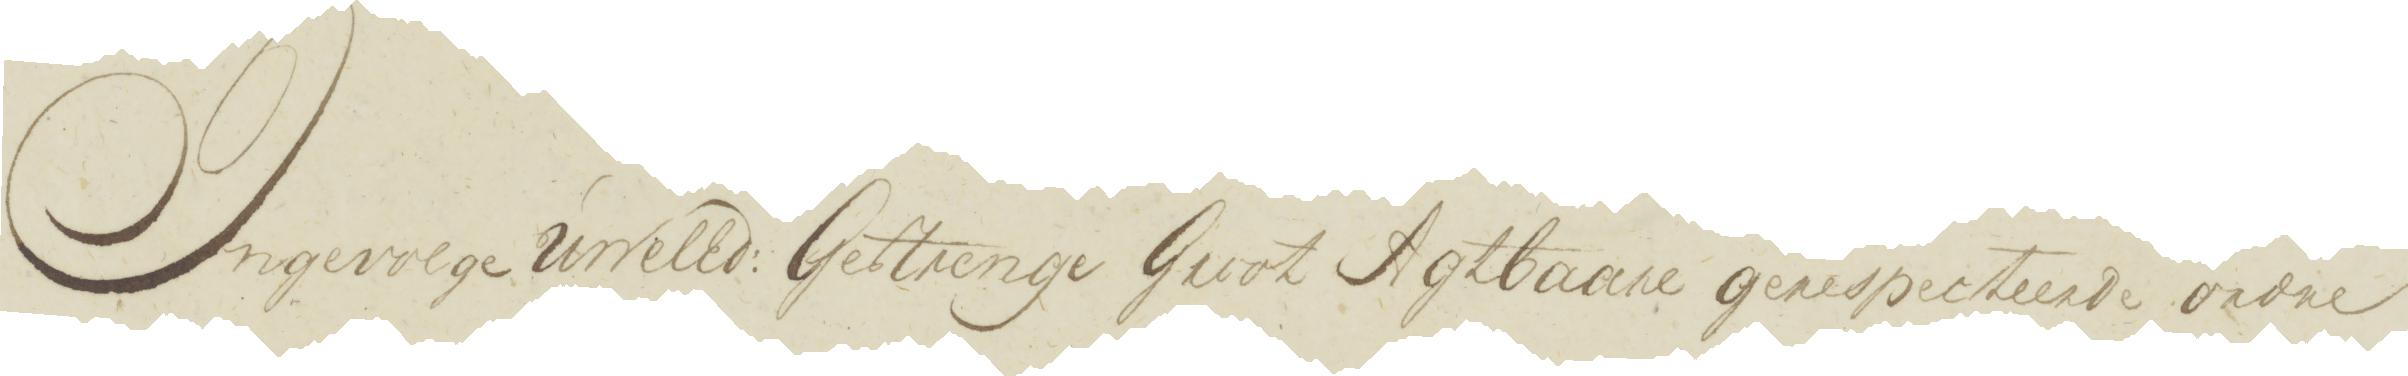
Ingevolge uwelEd: Gestrenge Groot Agtbaare gerespecteerde ordre
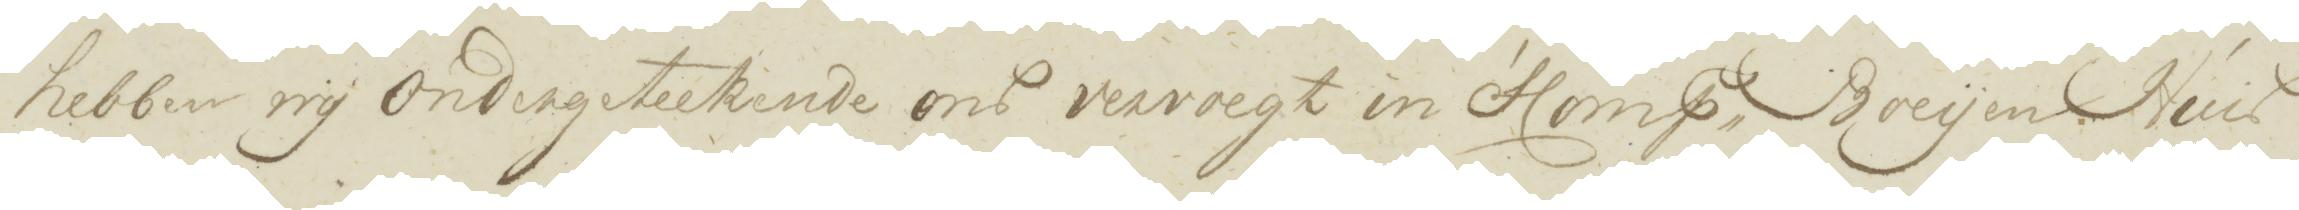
hebben wij ondergeteekende ons vervoegt in 'sComp„s Boeijen Huis
